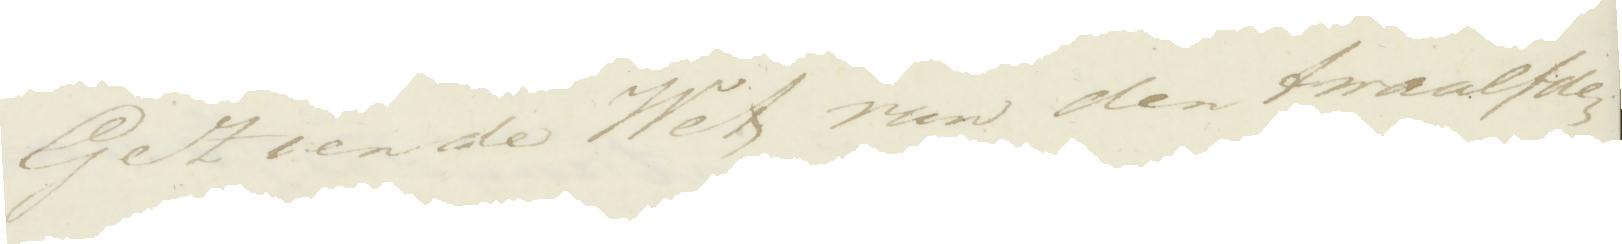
Gezien de Wet van den twaalfden
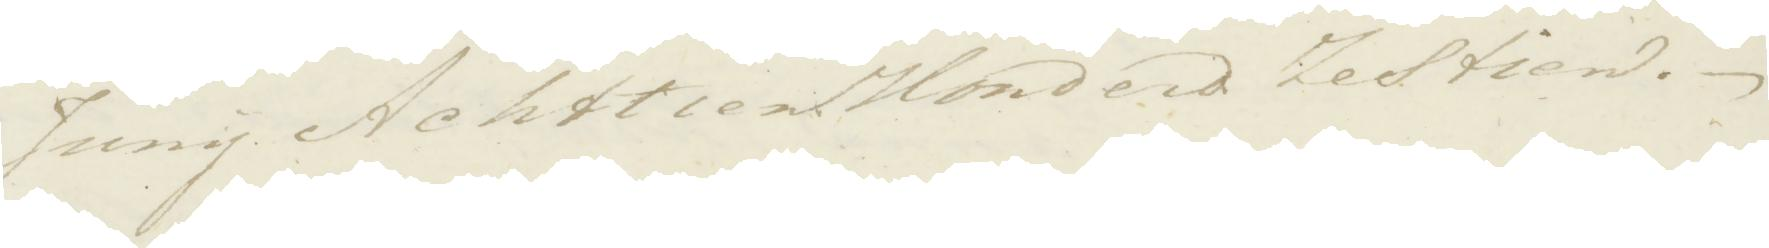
Junij Achttient Honderd Zestien.-
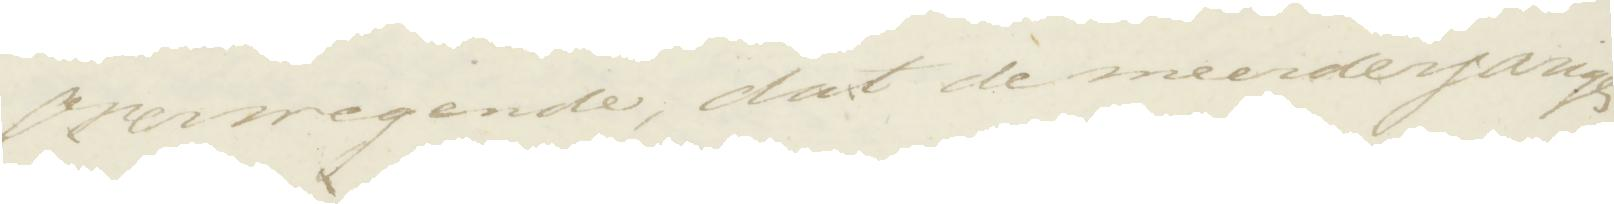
overwegende, dat de meerderjarigen
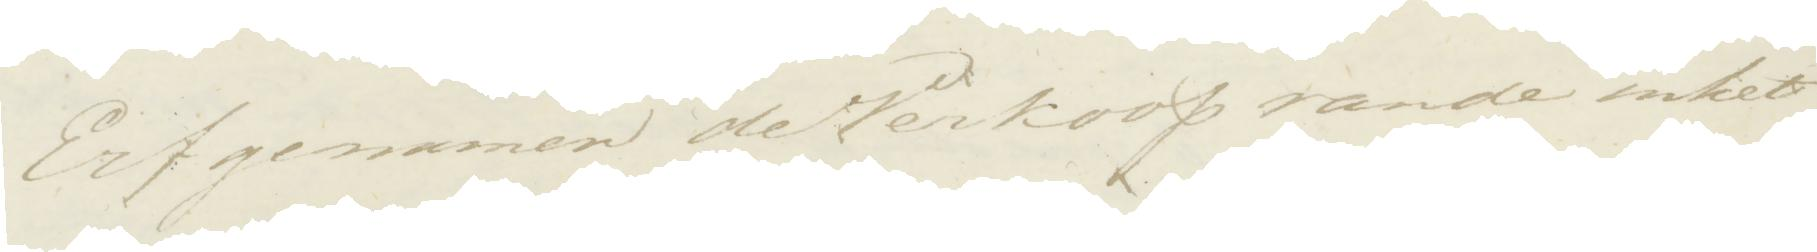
Erfgenamen de Verkoop van de inhet
